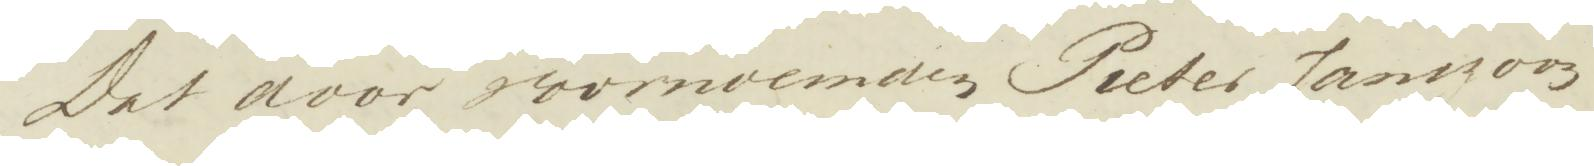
Dat door voornoemden Pieter Janszoon
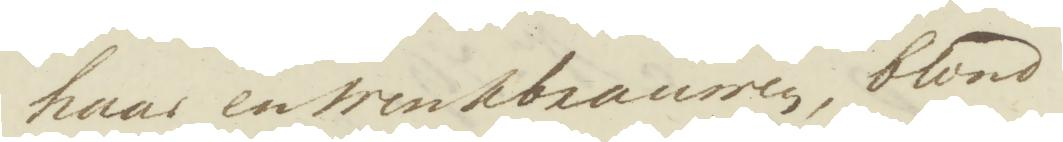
haar en wenkbrauwen, blond
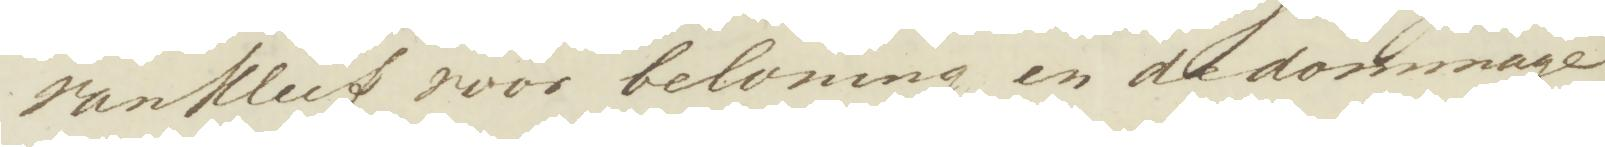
van Kleef voor beloning en de dommage
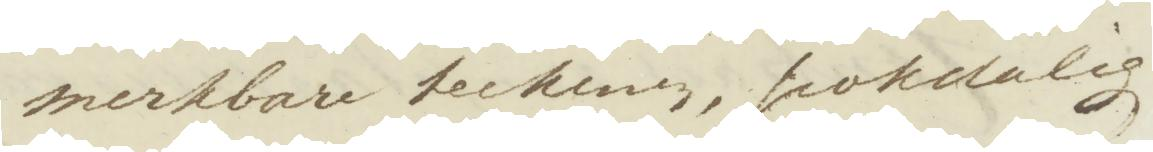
merkbare teekenen, pokdalig
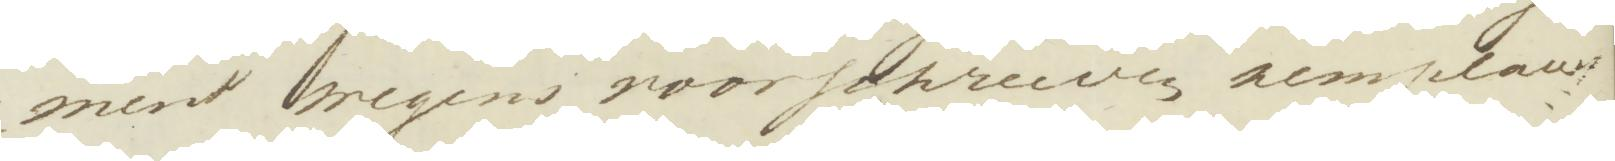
=ment wegens voorschreeven remplace
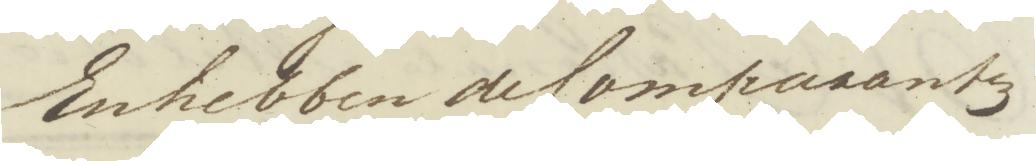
En hebben de Comparanten
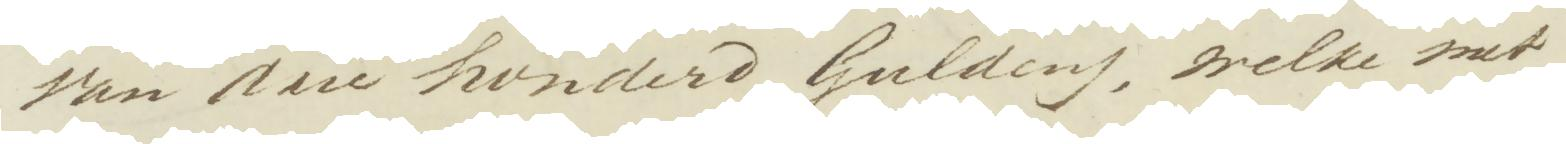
van drie honderd Guldens, welke met
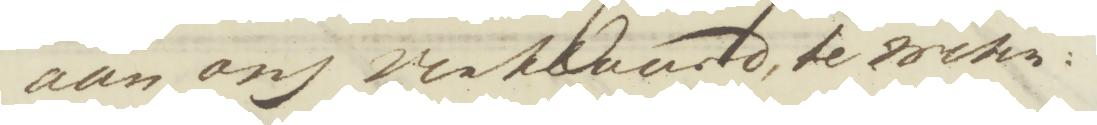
aan ons verklaard, te weten:
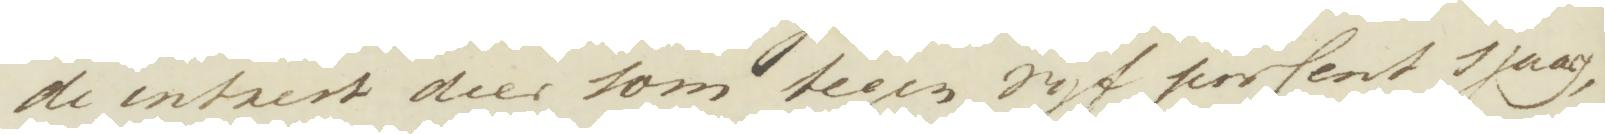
de intrest dier som tegen vyf percent s jaars,
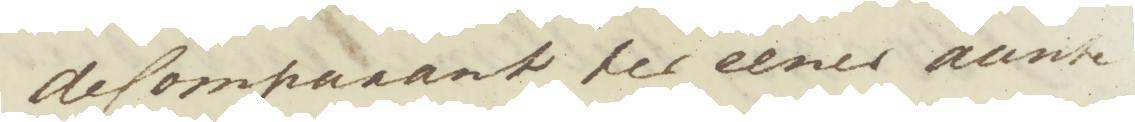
de Comparant ter eener aante
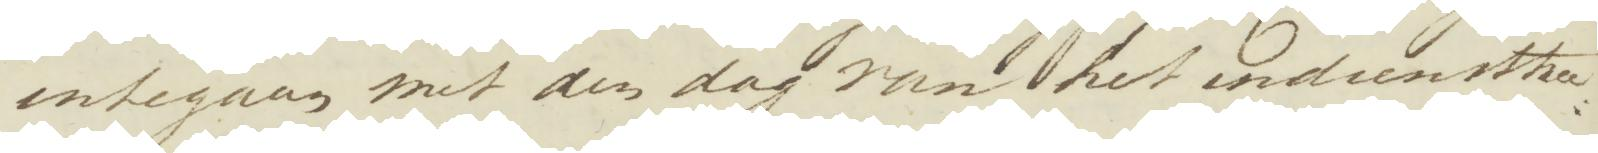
integaan met den dag van het indienst tre:
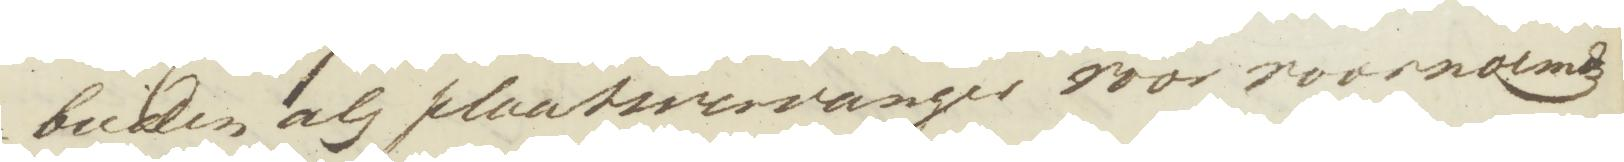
=bieden als plaatsvervanger voor voornoemden
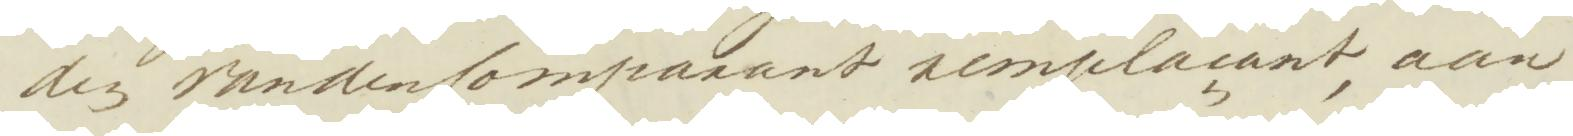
=den van den Comparant remplaçant, aan
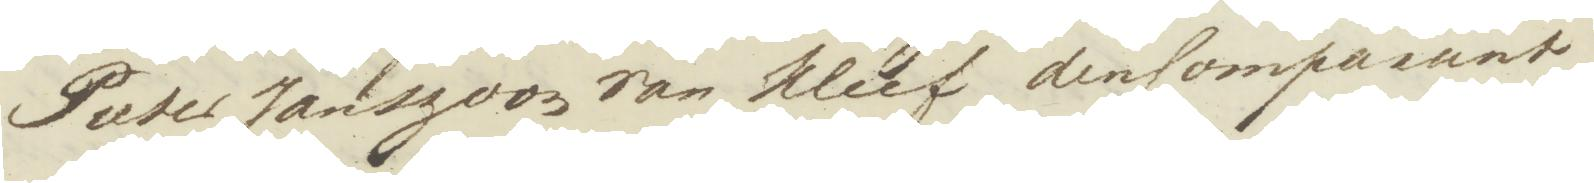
Pieter Janszoon van Kleef den Comparant
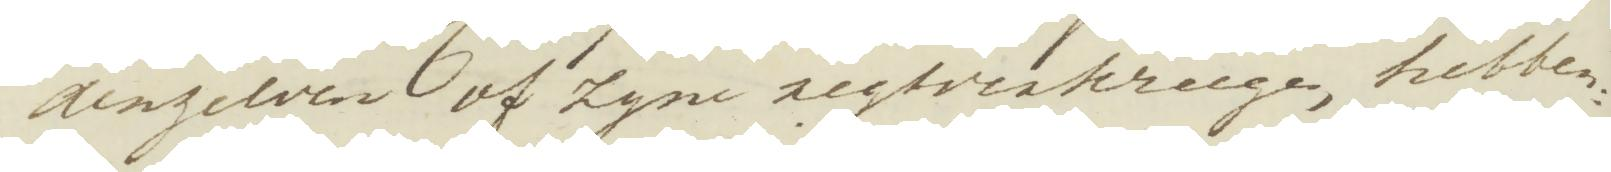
denzelven of zyne regtverkreege, hebben:
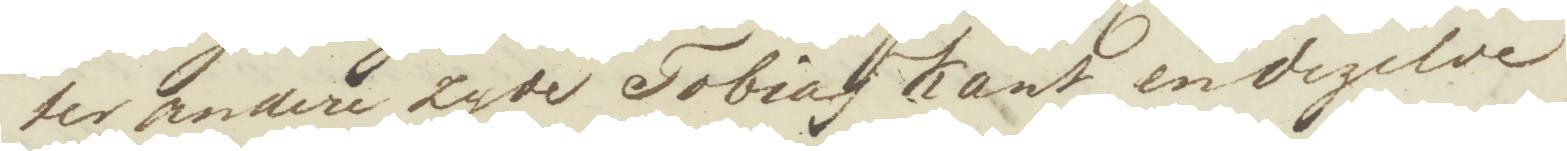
ter andere zyde Tobias Kant, en dezelve
